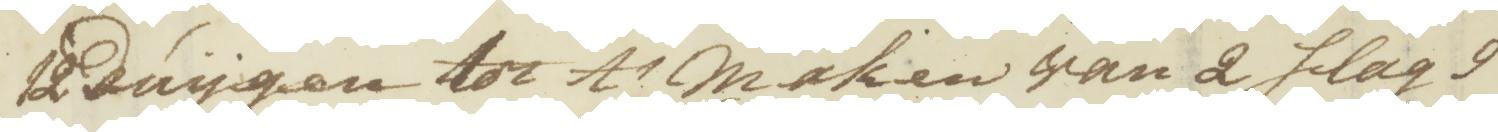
12 duijgen tot t' maken van 2 slag 9
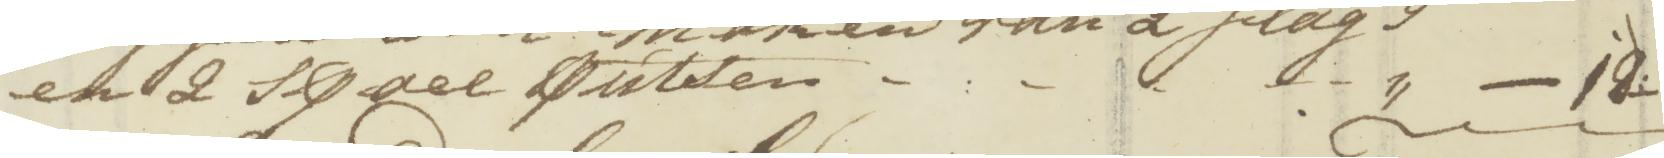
en 2 spael putsen „ — 18: —
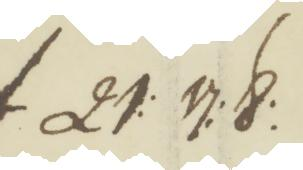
ƒ 21: 17: 8:
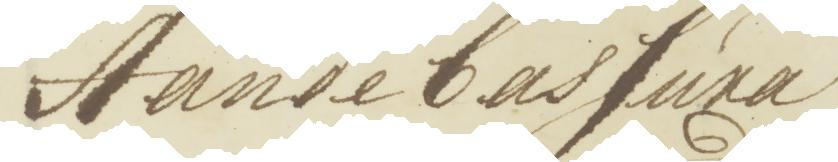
Aande bassura
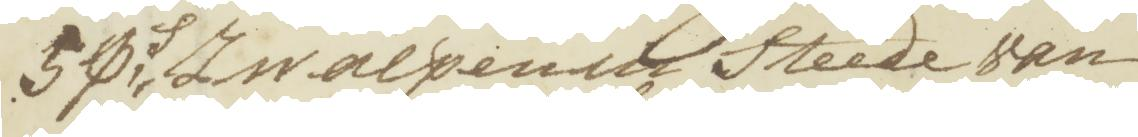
5 p„s zwalpen in steede van
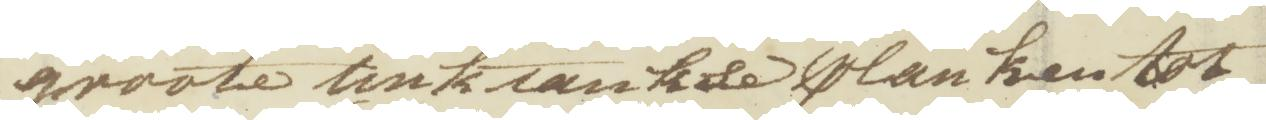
groote tink tankse planken tot
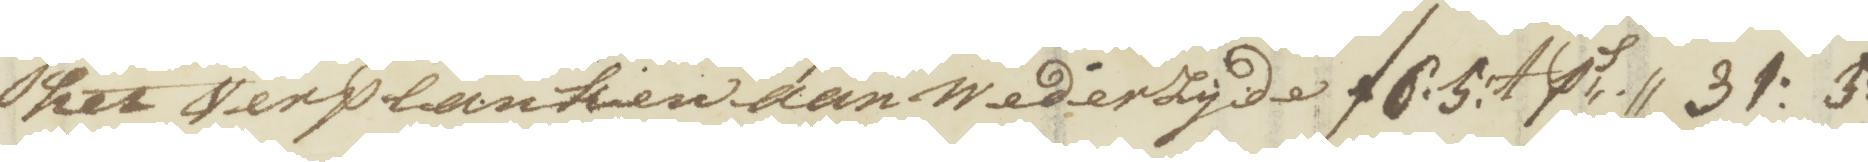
het verplanken aan weder zijde ƒ 6: 5: t p„s „ 31: 5: —
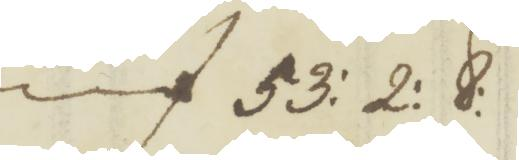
ƒ 53: 2: 8:
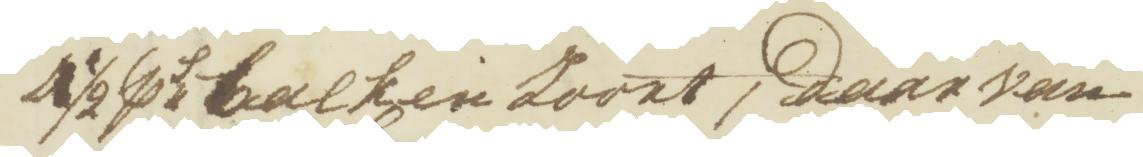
4½ p„s balken zoort, daar van
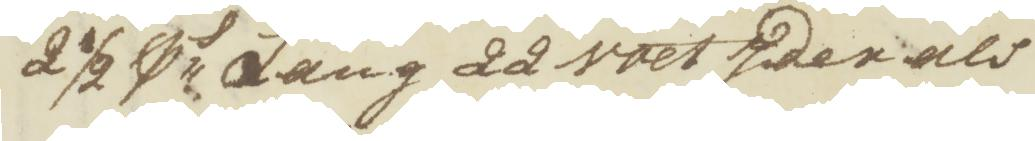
2½ p„s Lang 22 voet Ider als
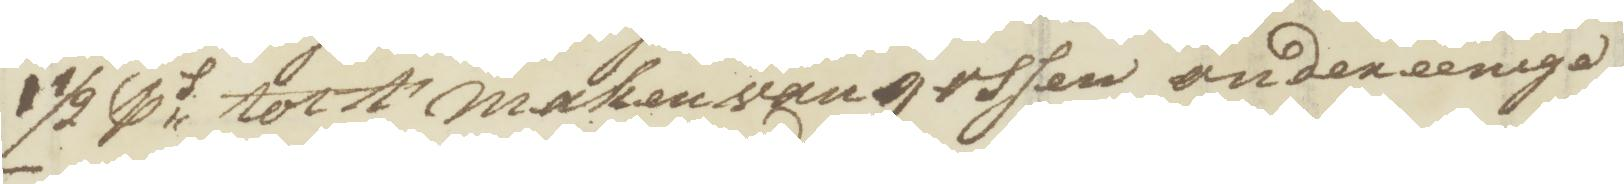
1½ p„s tot t' maken van gossen ondereenige
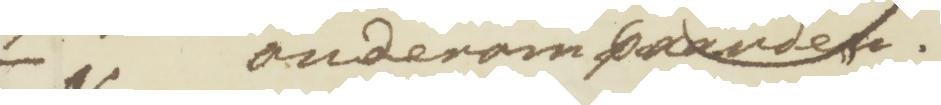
— onderom paarden. —
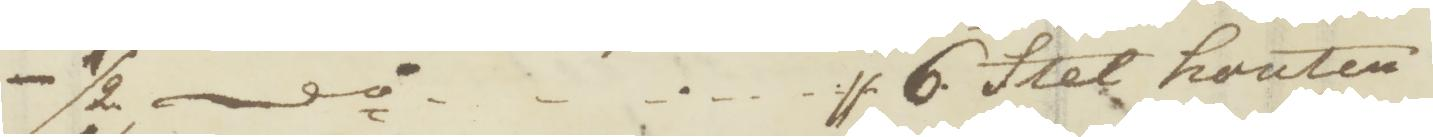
— ½ d=o „ 6. stel houten
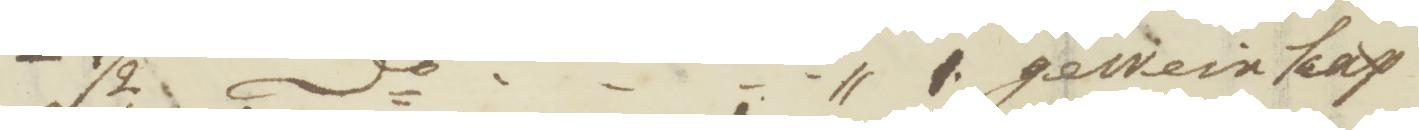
— ½ d=o „ 1. geweir kap
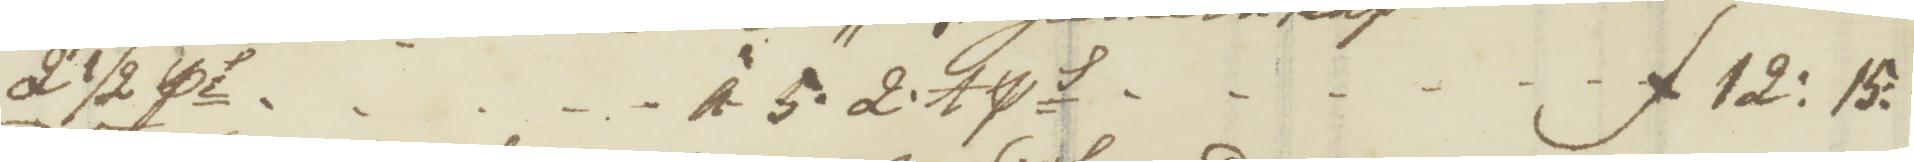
2 ½ p=s â 5. 2. t p=s ƒ 12: 15: —
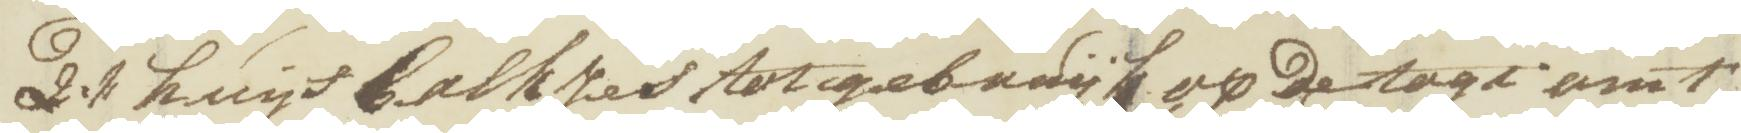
2. „ huijs balkjes tot gebruijk op de togt om t'
